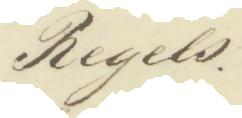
Regels.
